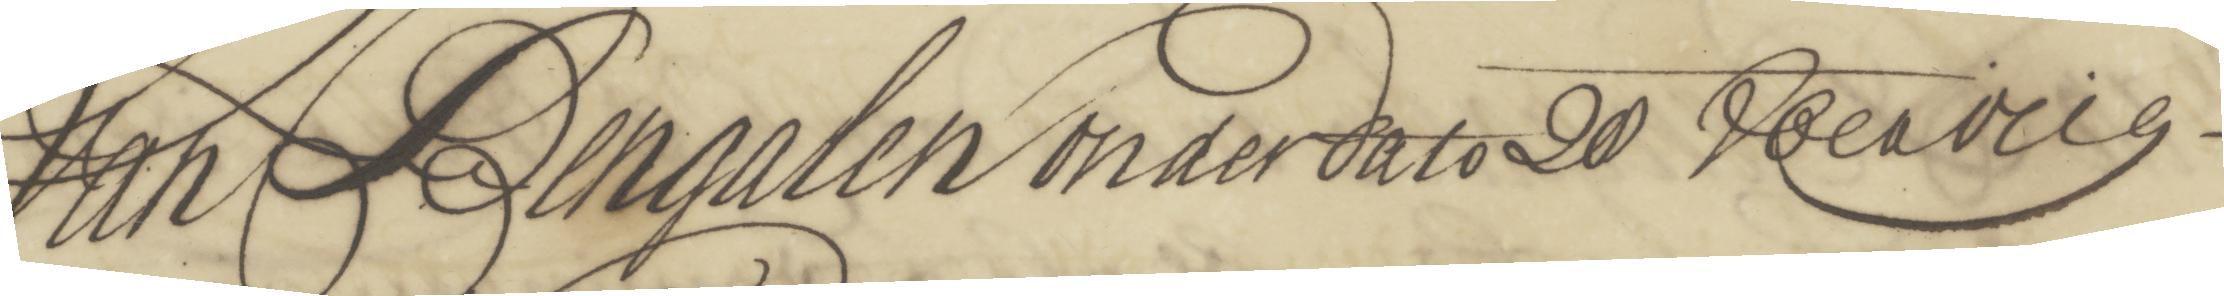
Van Bengalen onder dato 28 8ber 1719
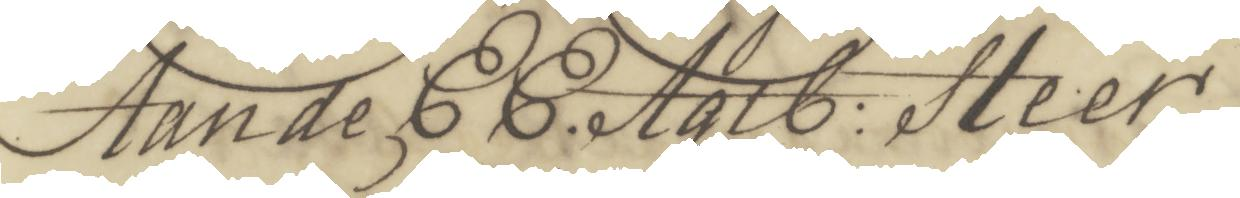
Aan de E E. Agbb: Heer
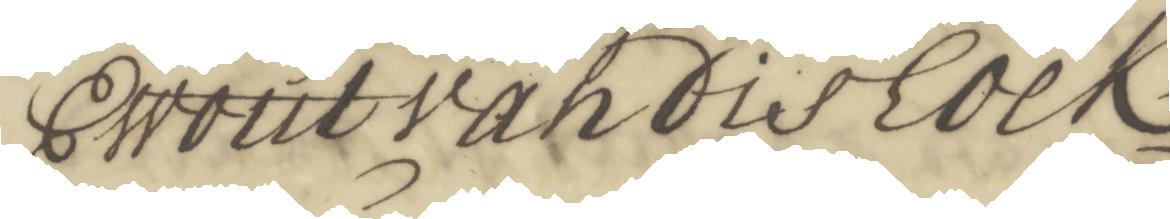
Ewout van dishoek
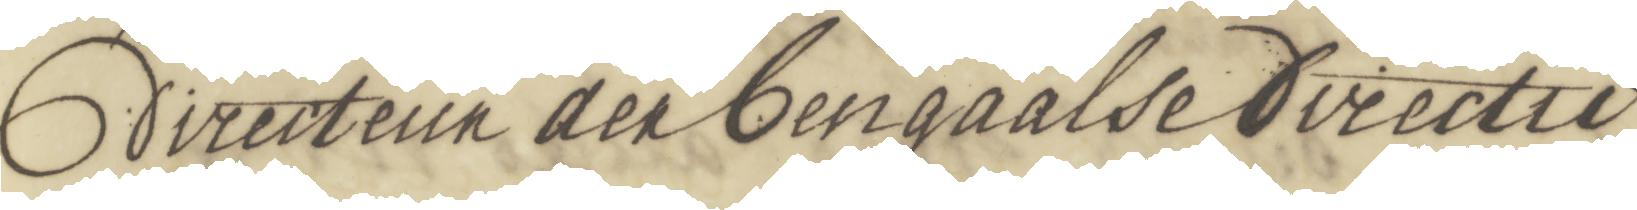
directeur der bengaalse directie
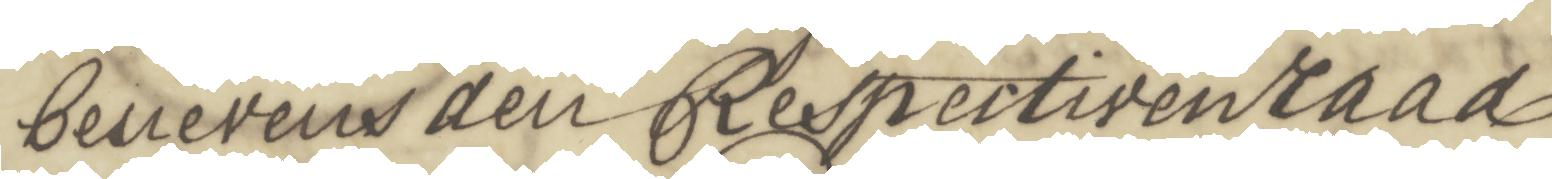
benevens den Respectiven raad
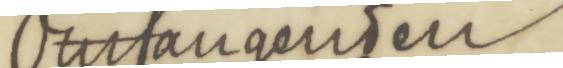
Ontfangenden
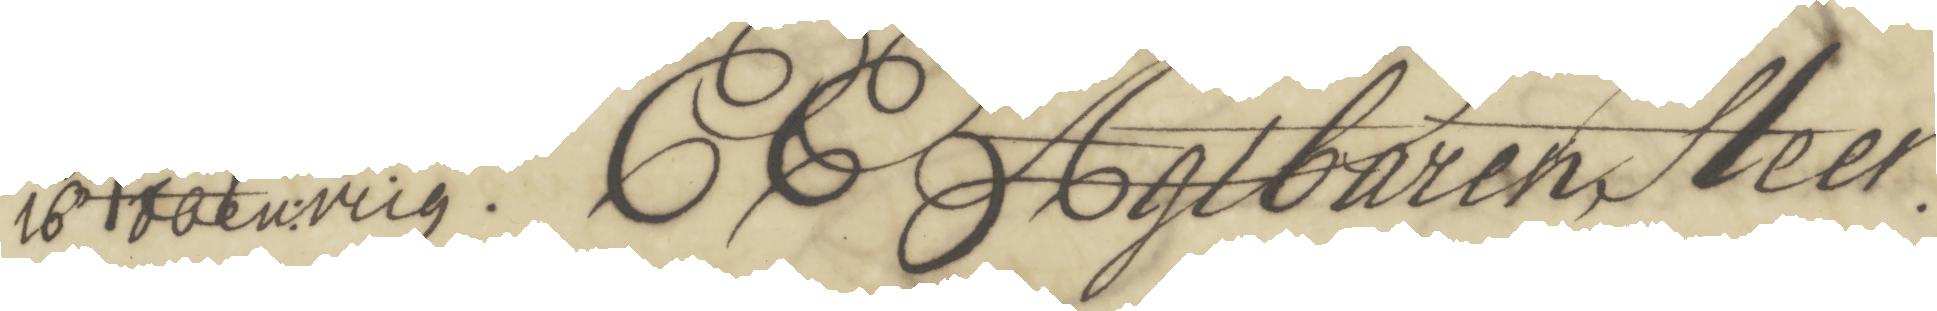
16 8ber: 1719. E E Agtbaren Heer
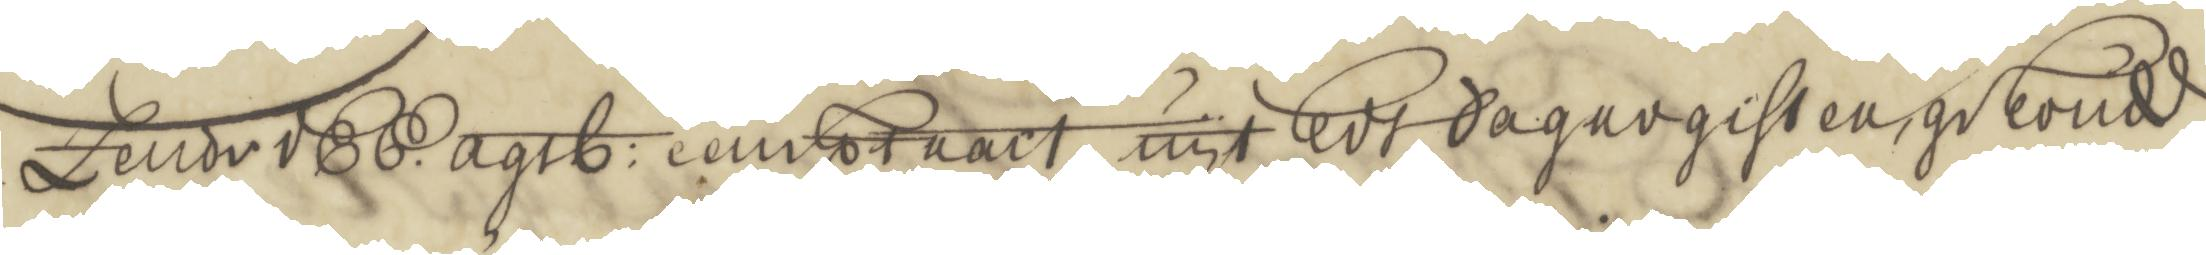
Zende vE E: agtb: een Extract uijt het dagregister, gehouden
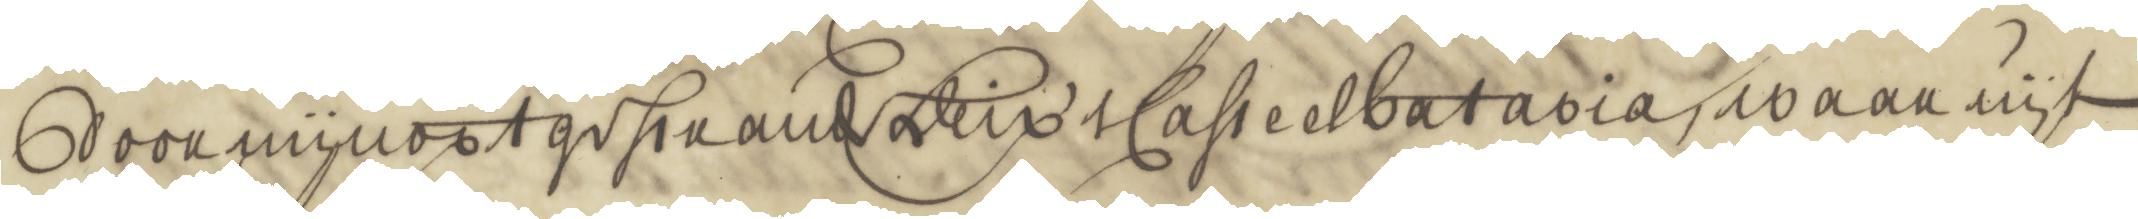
door mijn op 't gestrand schip 'tCasteel batavia, waar uijt
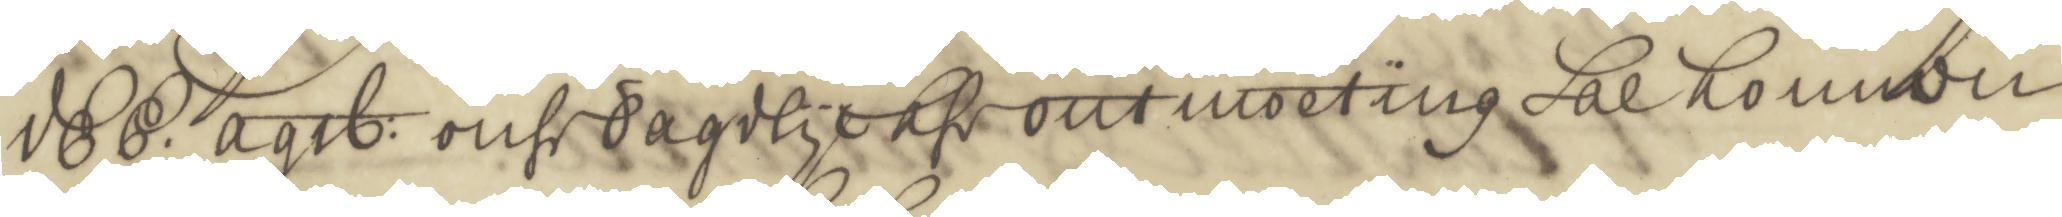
VE E. agtb: onse dagelijckse ontmoeting sal konnen
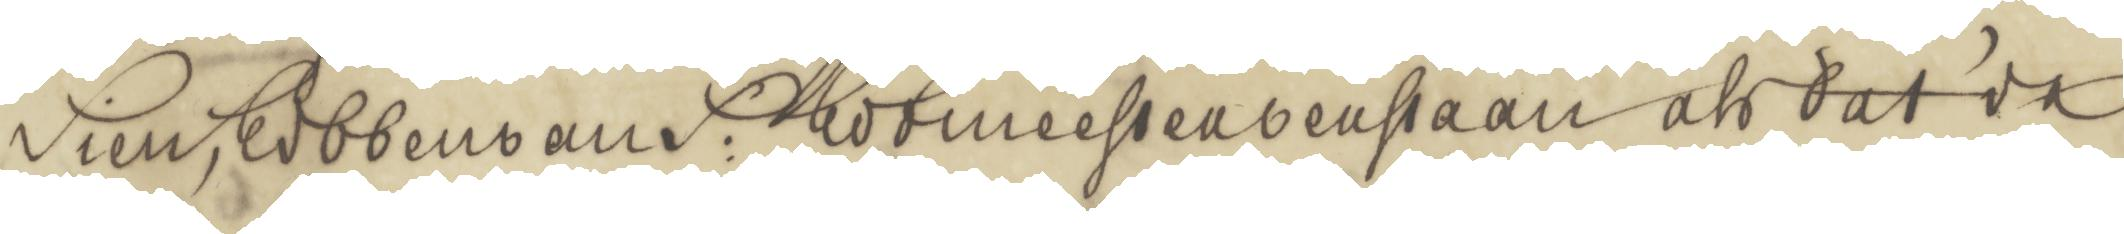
sien, hebben van S: hofmeester verstaan als dat 'er
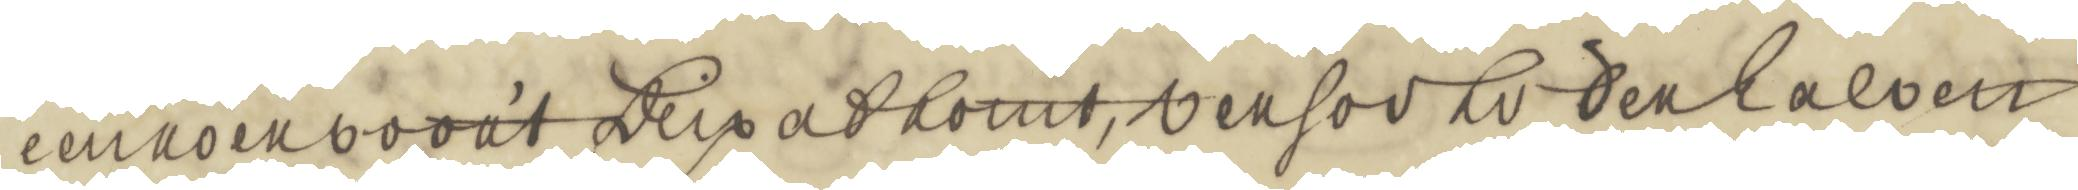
een roer voor't schip afkomt, versoeke derhalven
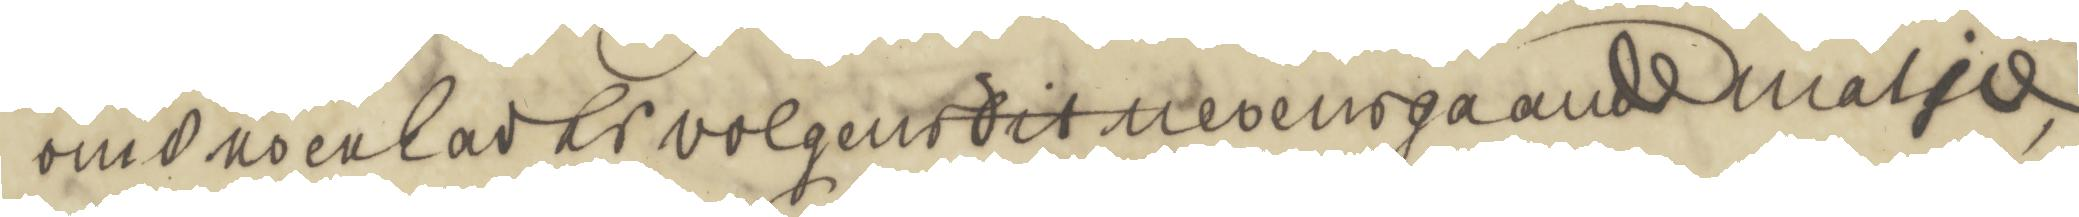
om 8 roer haeks volgens dit nevensgaande matje,
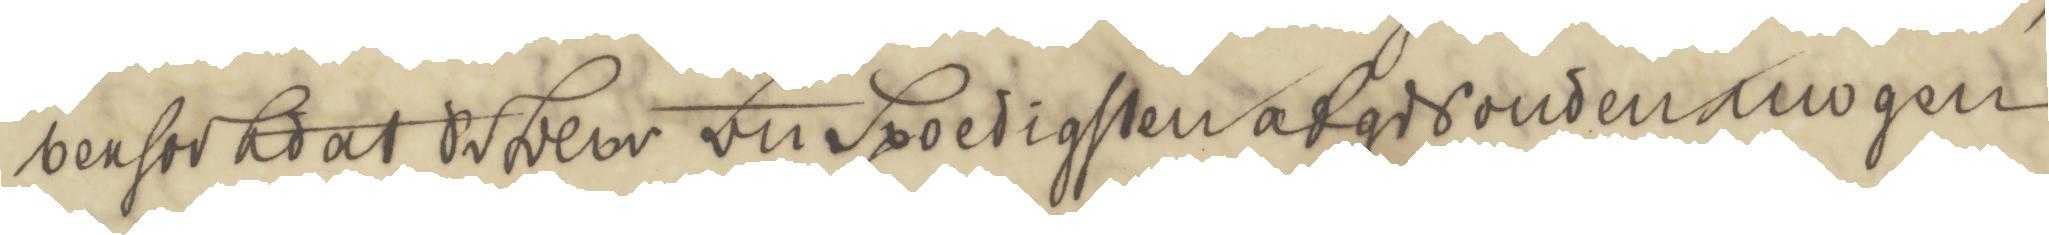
versoek dat deselve ten spoedigsten afgesonden mogen
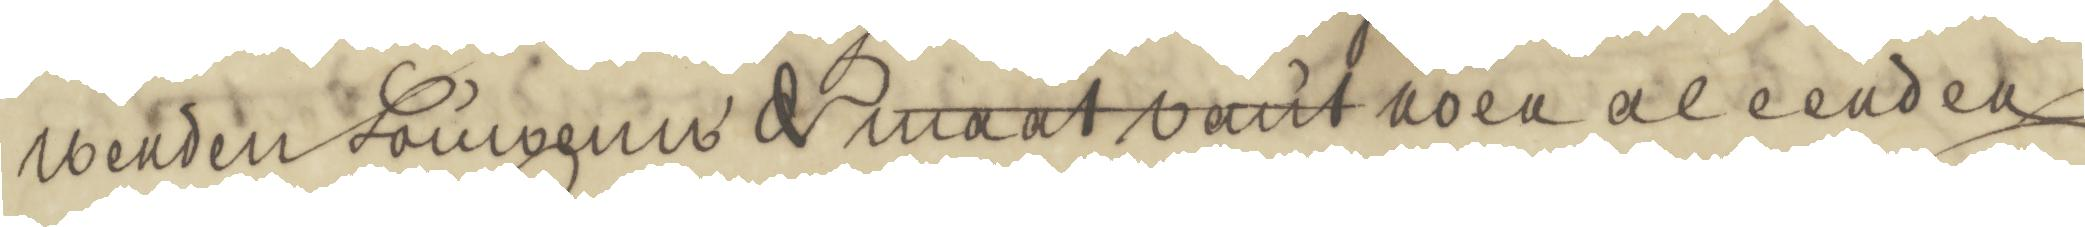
werden souwenu de maat van't roer al eerder
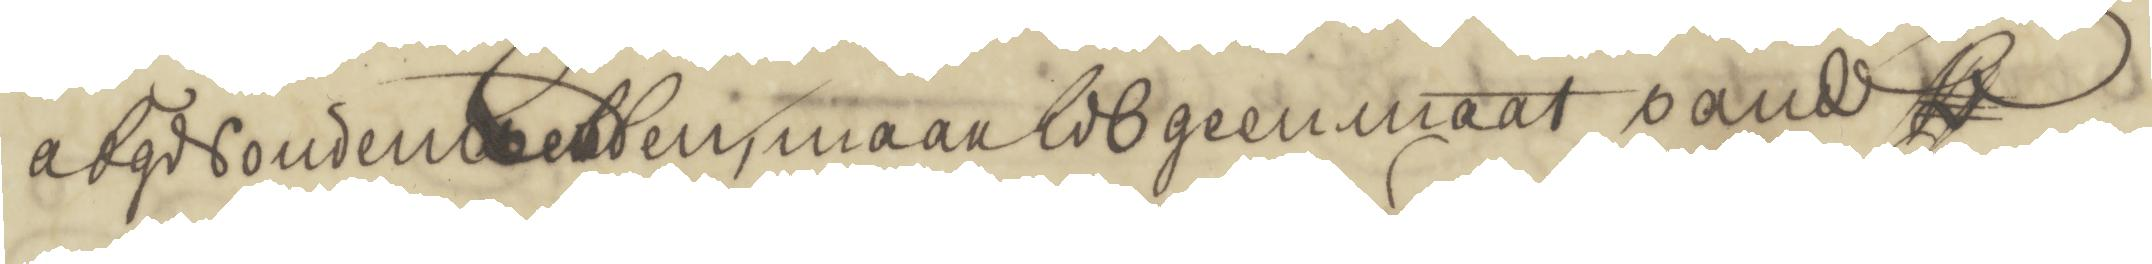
afgesonden hebben, maar heb geen maat vandese
